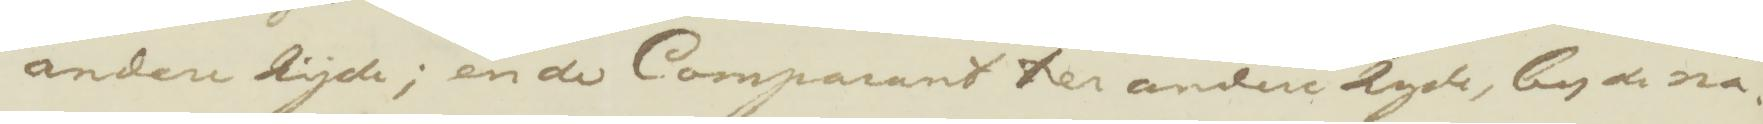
andere zijde; en de Comparant ter andere zyde, bij de na
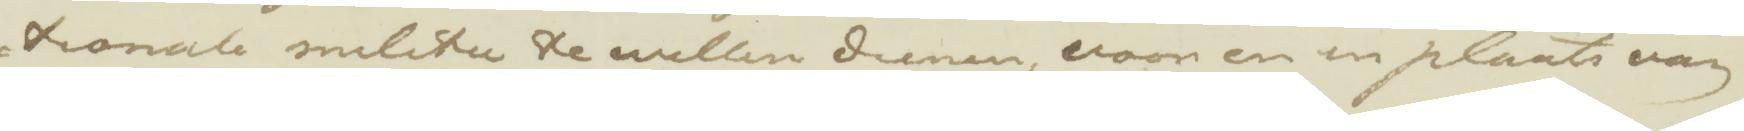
tionale militie te willen dienen, voor en in plaats van
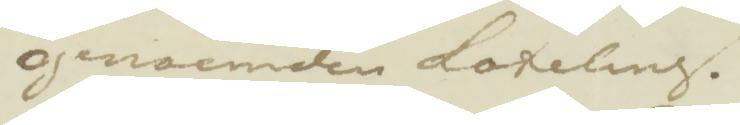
genoemden Loteling.
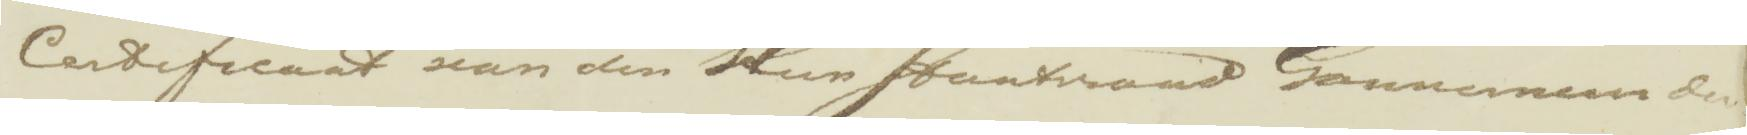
Certificaat van den Heer Staatsraad Gouverneur der
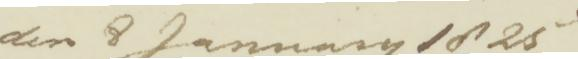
den 8 January 1825
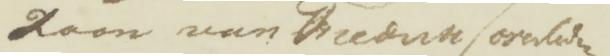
Zoon van Fredrik /overleden
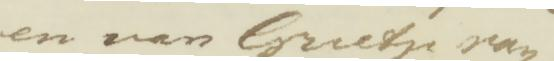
en van Grietje van
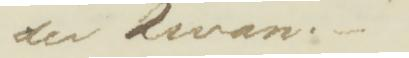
der Zwan.—
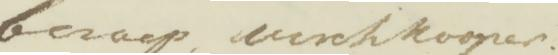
beroep, vischkooper.
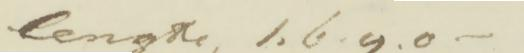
lengte, 1. 6. 9.0 .—
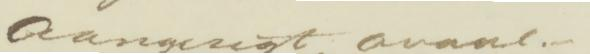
Aangezigt, ovaal.—
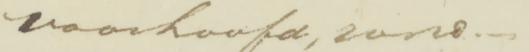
Voorhoofd, rond.—
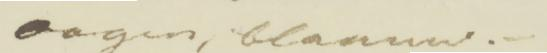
Oogen, blaauw.—
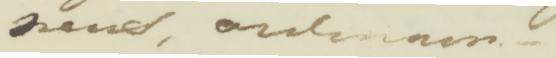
neus, ordinair.—
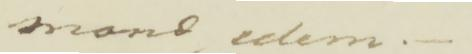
mond, idem.—
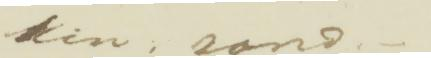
kin, rond.—
